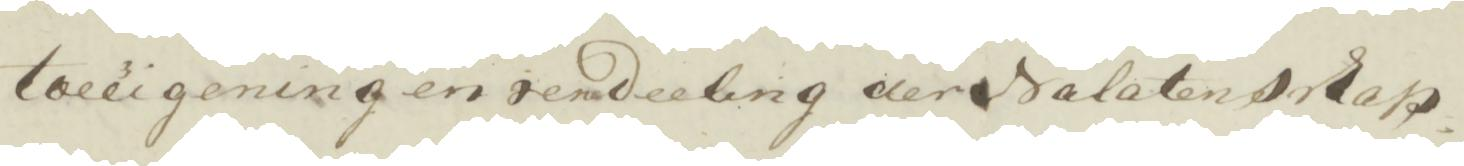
toeëigening en verdeeling der Nalatenschap
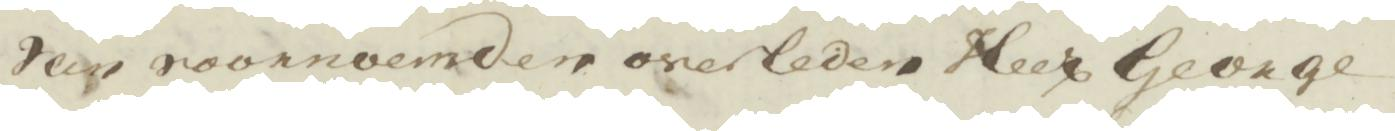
van voornoemden overleden Heer George
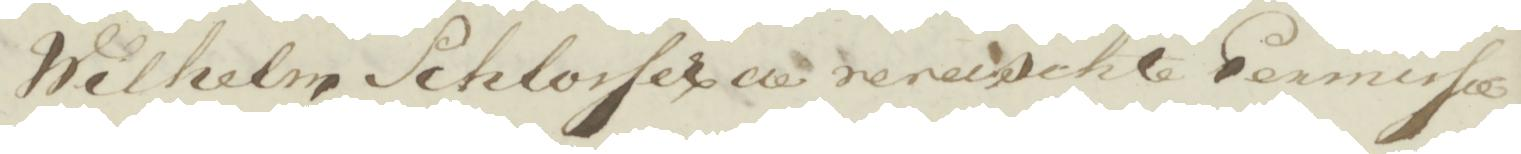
Wilhelm Schlosser de vereischte Permissie
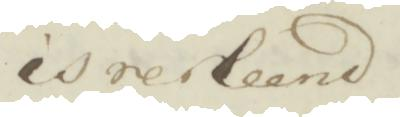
is verleend
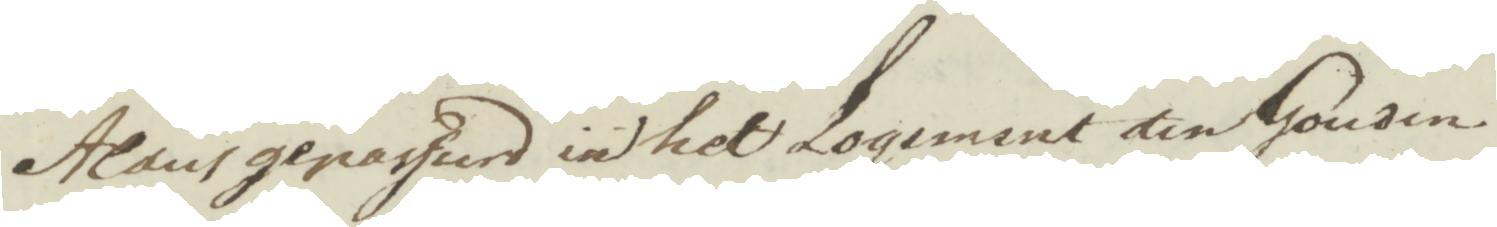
Aldus gepasseerd in het Logement den Gouden
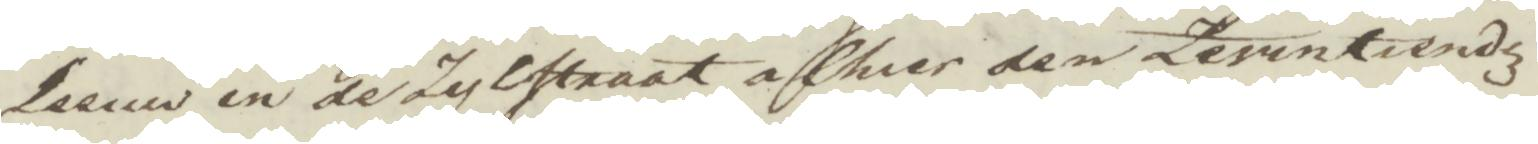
Leeuw in de Zylstraat alhier den Zeventienden
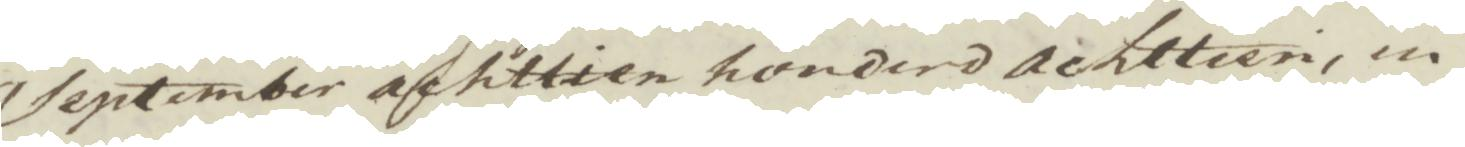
September achttien honderd achttien, in
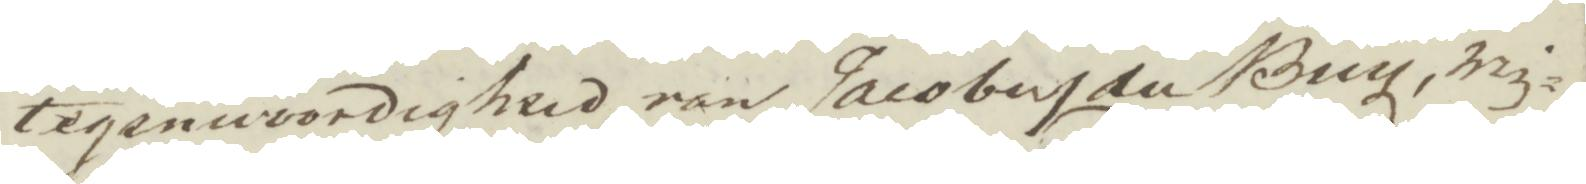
tegenwoordigheid van Jacobus du Buy, win=
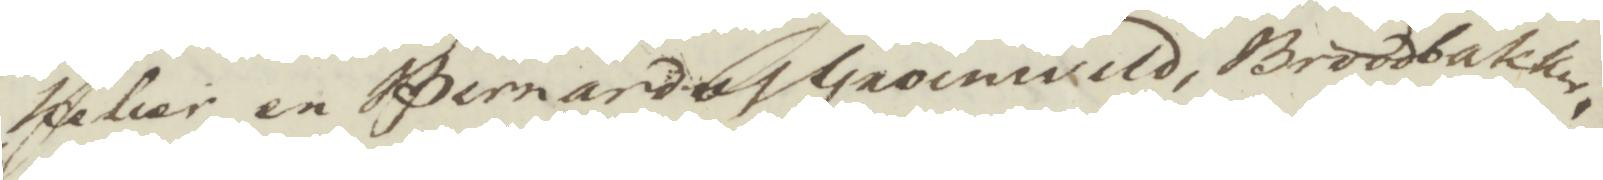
kelier en Bernardus Groeneveld, Broodbakker,
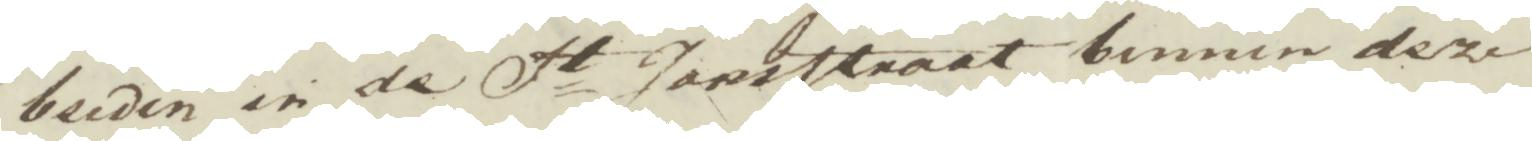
beiden in de S=t Jansstraat binnen deze
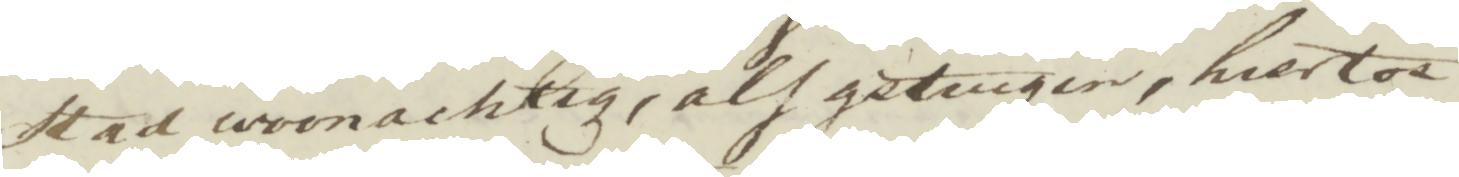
stad woonachtig, als getuigen, hiertoe
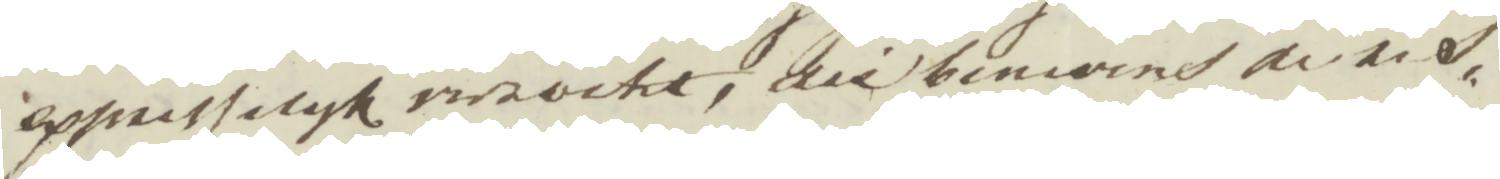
expresselyk verzocht, die benevens de res„
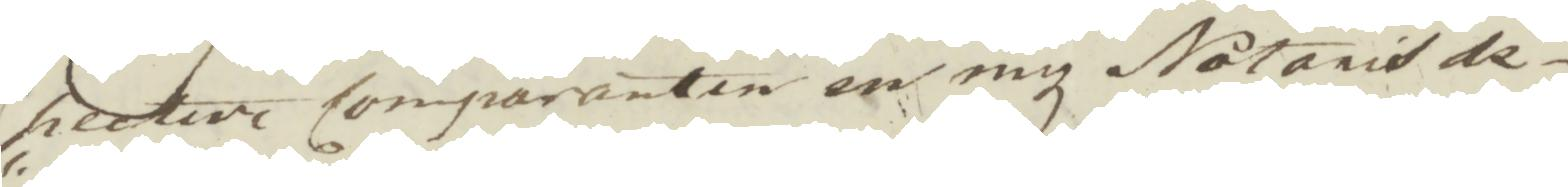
pective Comparanten en my Notaris de
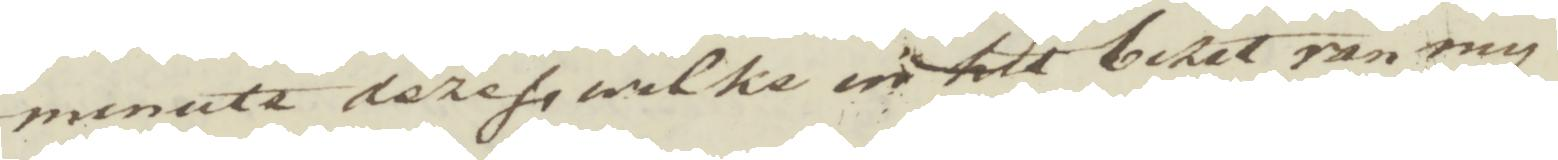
minute dezes, welke in het bezit van my
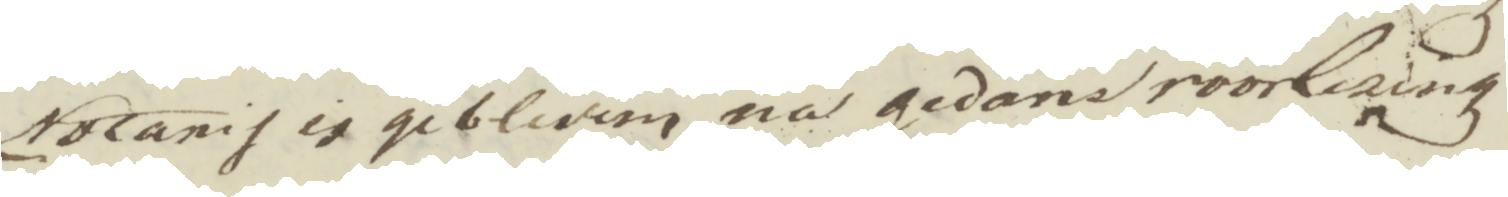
notaris is gebleven na gedane voorlezing
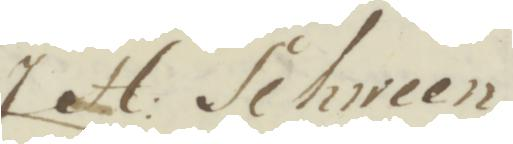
J.H: Schween
